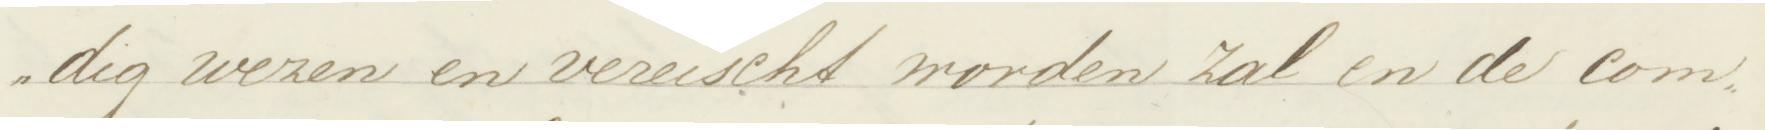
„dig wezen en vereischt worden zal en de com„
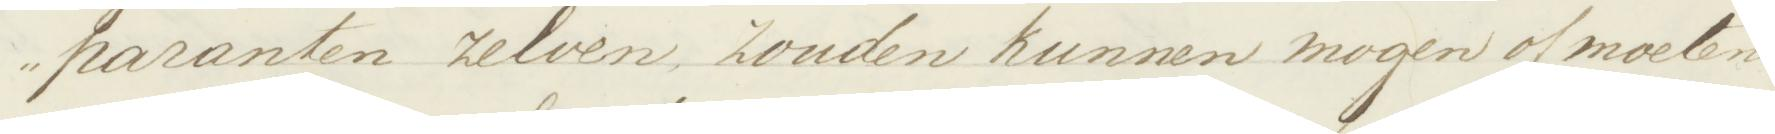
„paranten zelven, zouden kunnen mogen of moeten
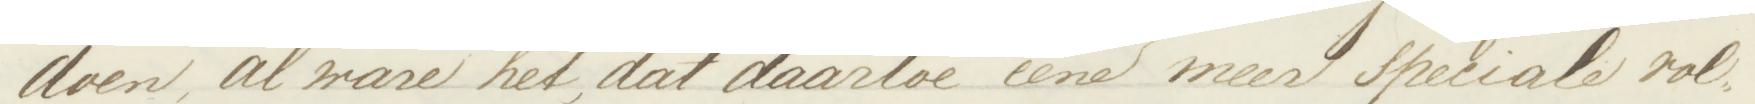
doen, al ware het, dat daartoe eene meer speciale vol„
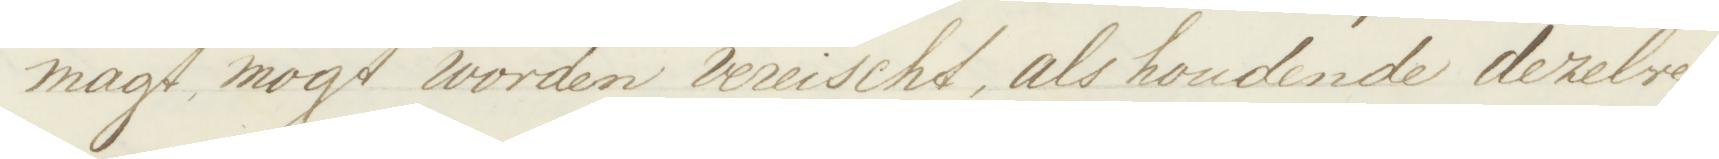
magt, mogt worden vereischt, als houdende dezelve
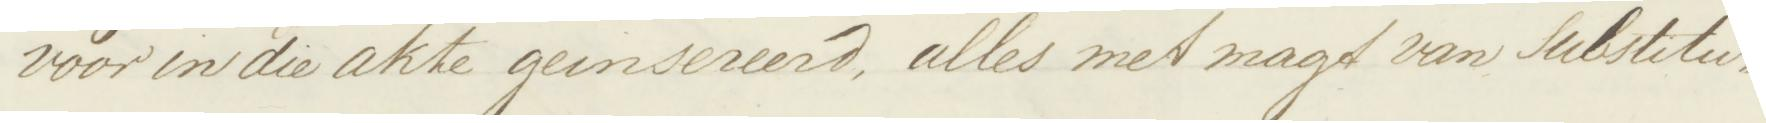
voor in die akte geinsereerd, alles met magt van substitu„
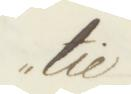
„tie
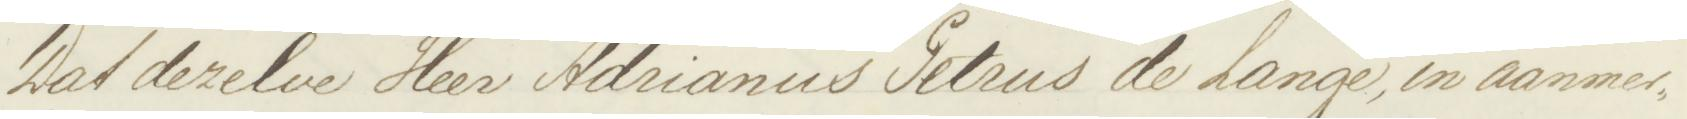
Dat dezelve Heer Adrianus Petrus de Lange, in aanmer„
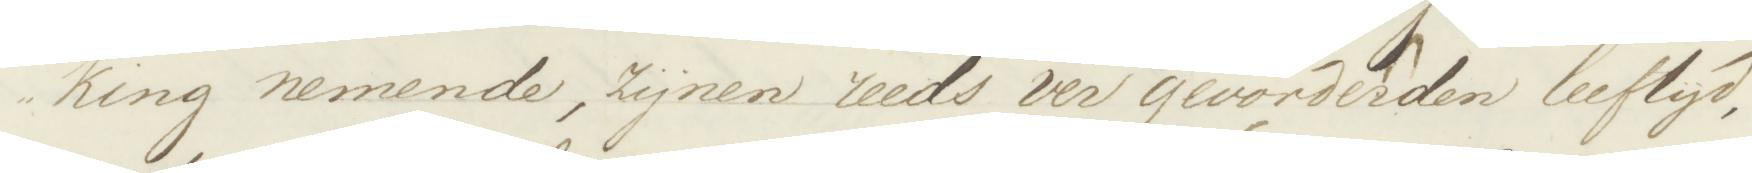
„king nemende, zijnen reeds ver gevorderden leeftijd,
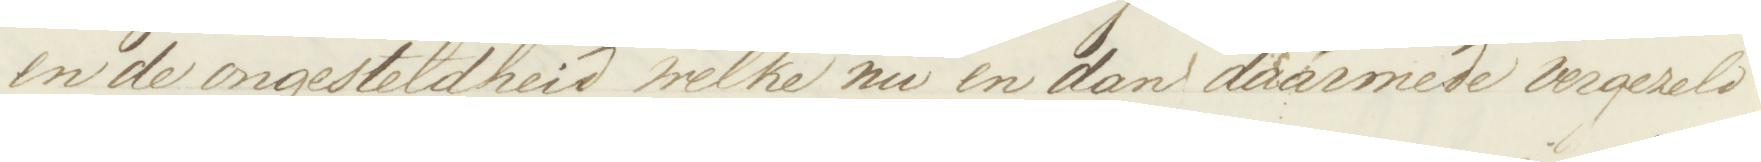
en de ongesteldheid welke nu en dan daarmede vergezeld
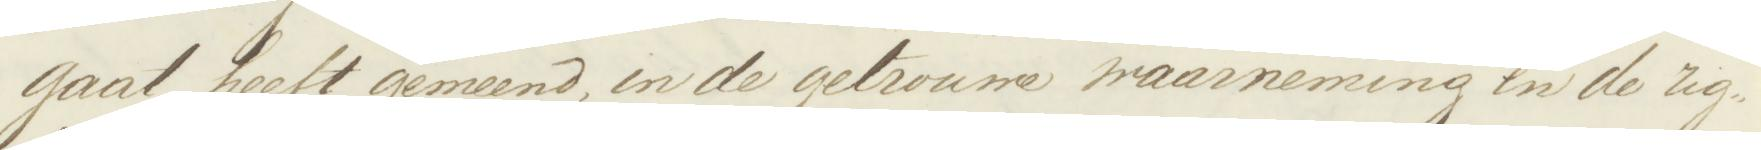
gaat, heeft gemeend, in de getrouwe waarneming en de rig„
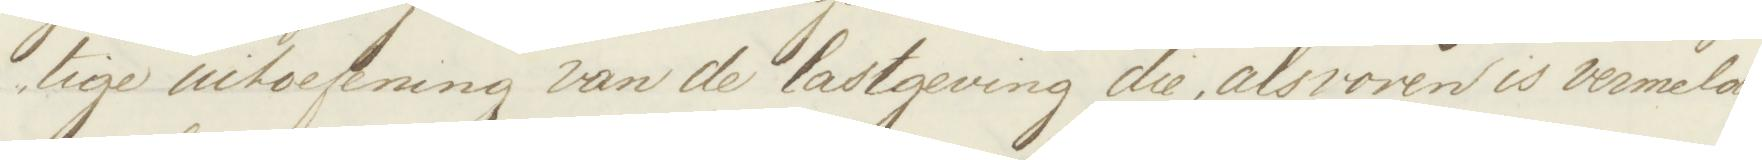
„tige uitoefening van de lastgeving die, als voren is vermeld,
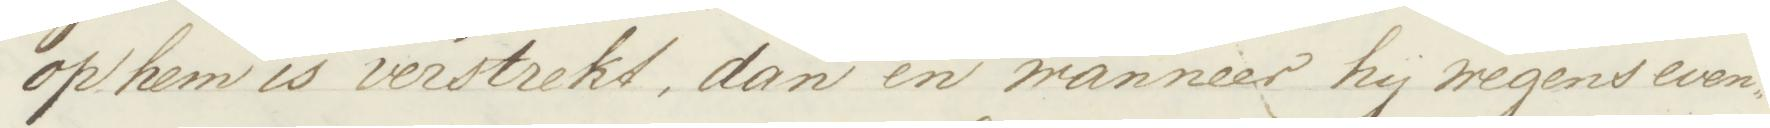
op hem is verstrekt, dan en wanneer hij wegens even„
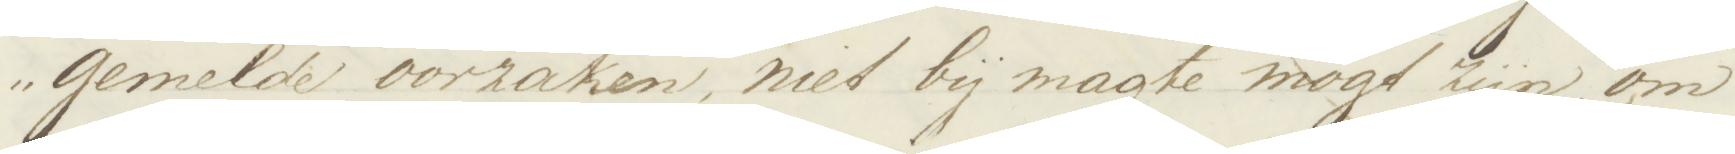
„Gemelde oorzaken, niet bij magte mogt zijn, om
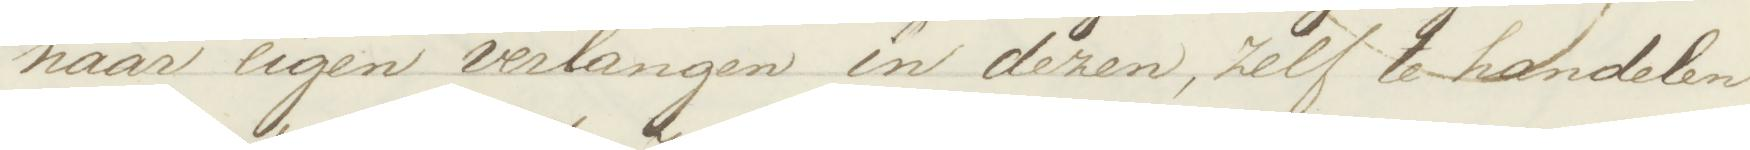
naar eigen verlangen in dezen, zelf te handelen
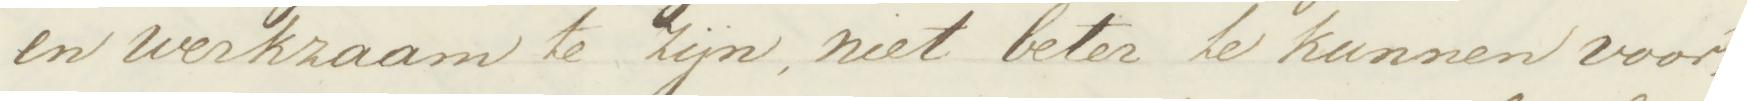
en werkzaam te zijn, niet beter te kunnen voor„
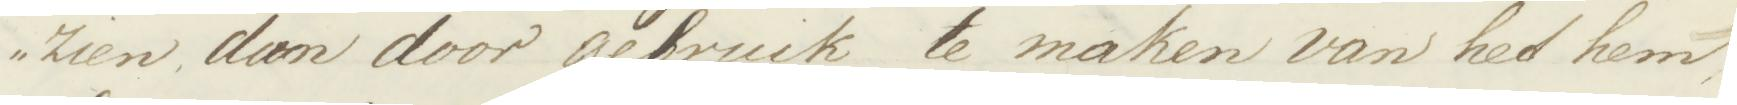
„zien, dan door gebruik te maken van het hem,
